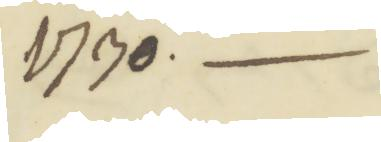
1730. —
